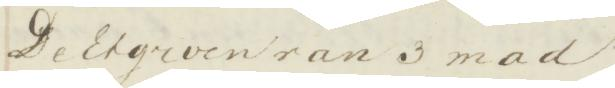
De Etgroen van 3 mad
